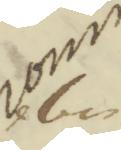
en bis
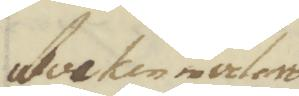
Boeken in octavo
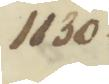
1130
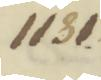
1131.
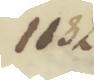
1132
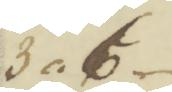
3 a 6.
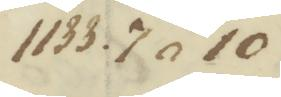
1133. 7 a 10
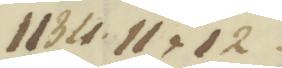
1134. 11 en 12
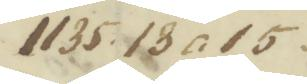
1135. 13 a 15
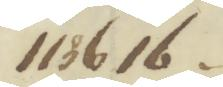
1136 16.
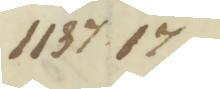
1137: 17
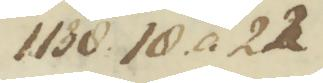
1138. 18. a 22
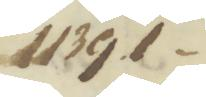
1139. 1.
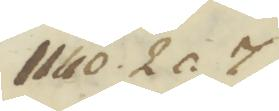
1140. 2 a 7
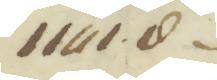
1141. 8
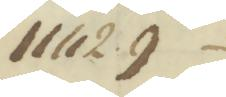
1142. 9
